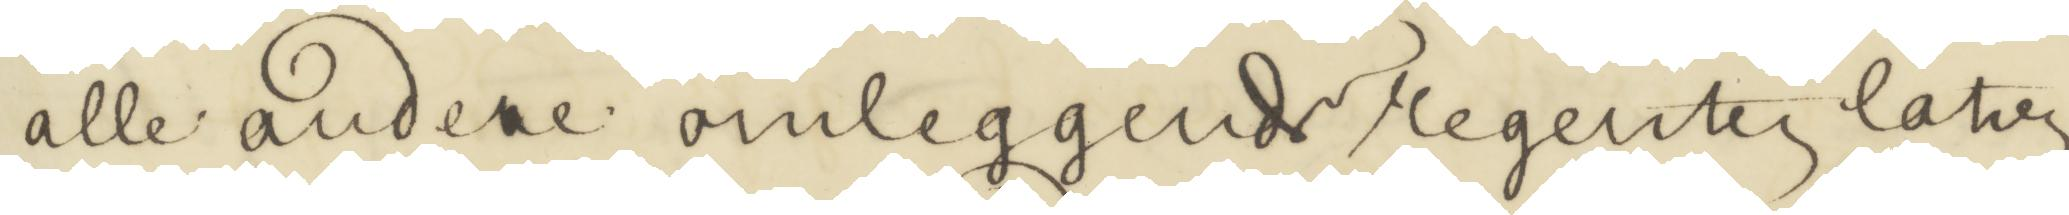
alle andere omleggende regenten laten
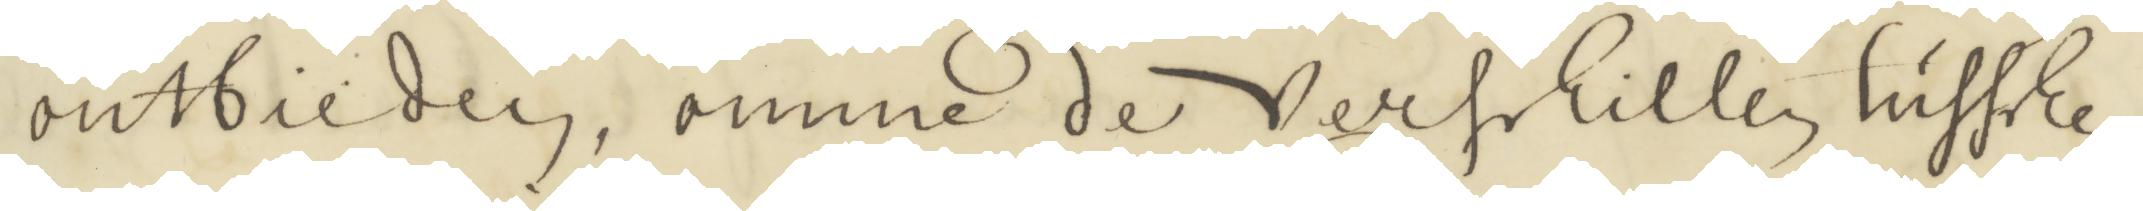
ontbieden, omme de Verschillen tusschen
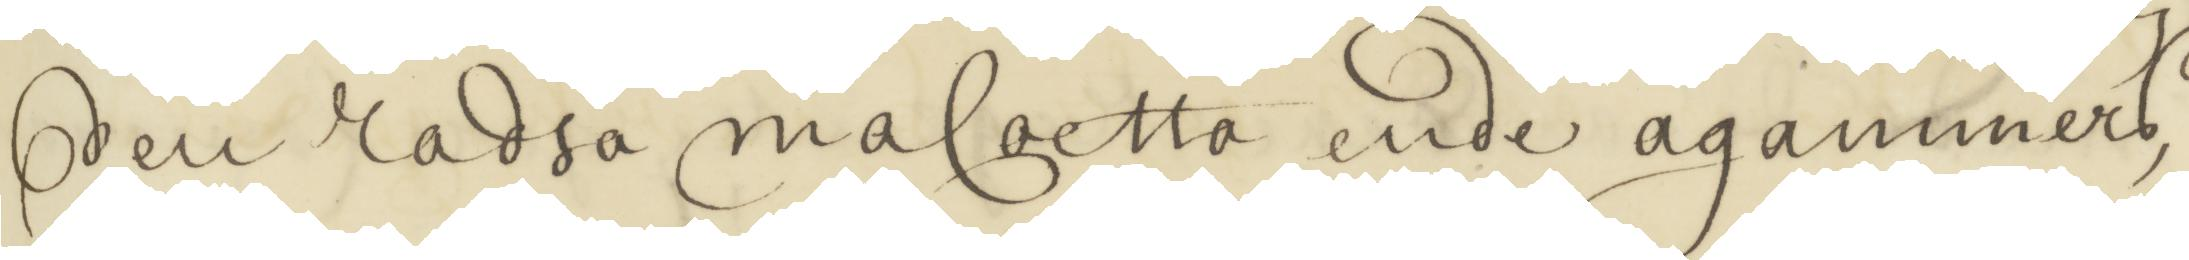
den radja macoetta ende agammers,
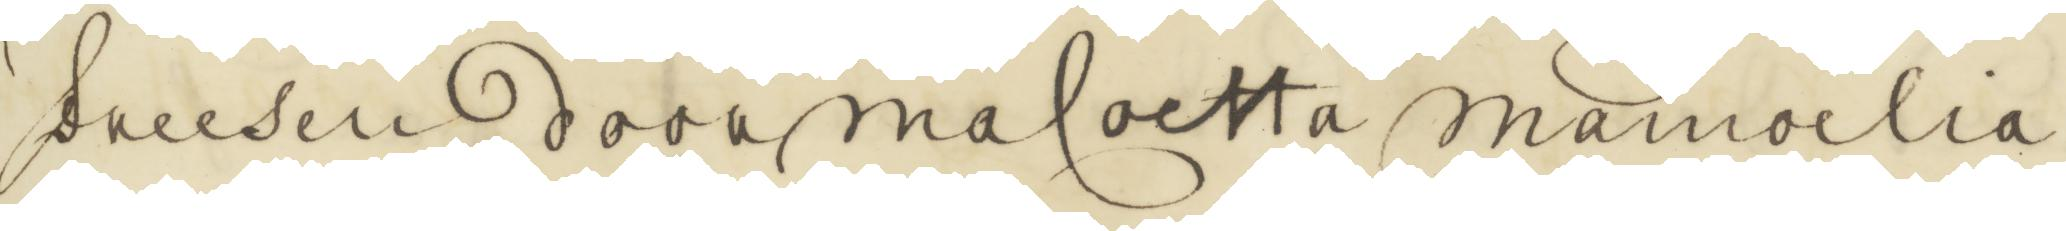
verreesen door macoetta mamoelia
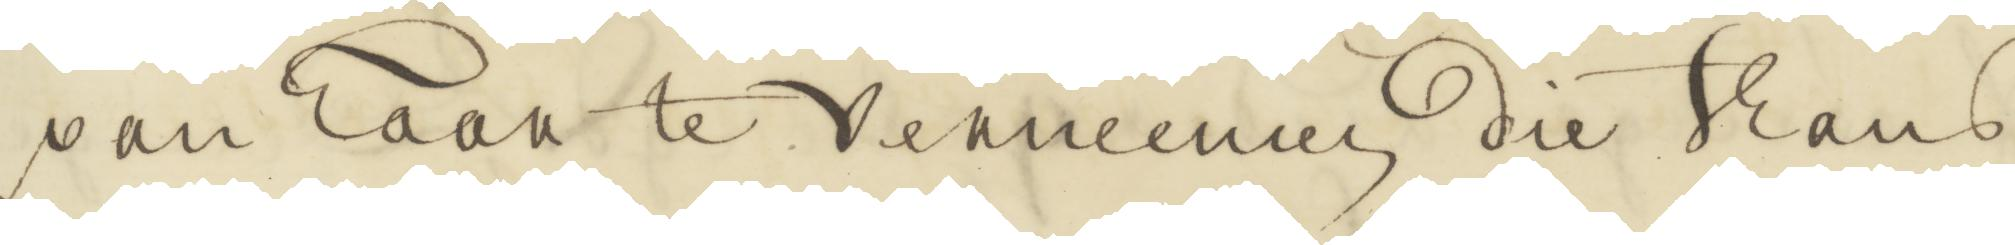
van haar te verneemen die thans
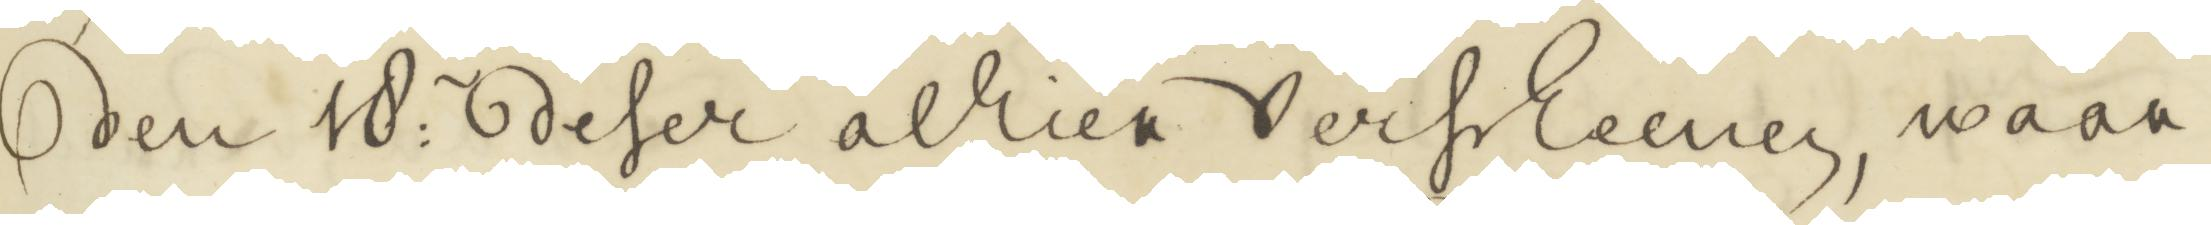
den 18:' deser alhier verscheenen, waar
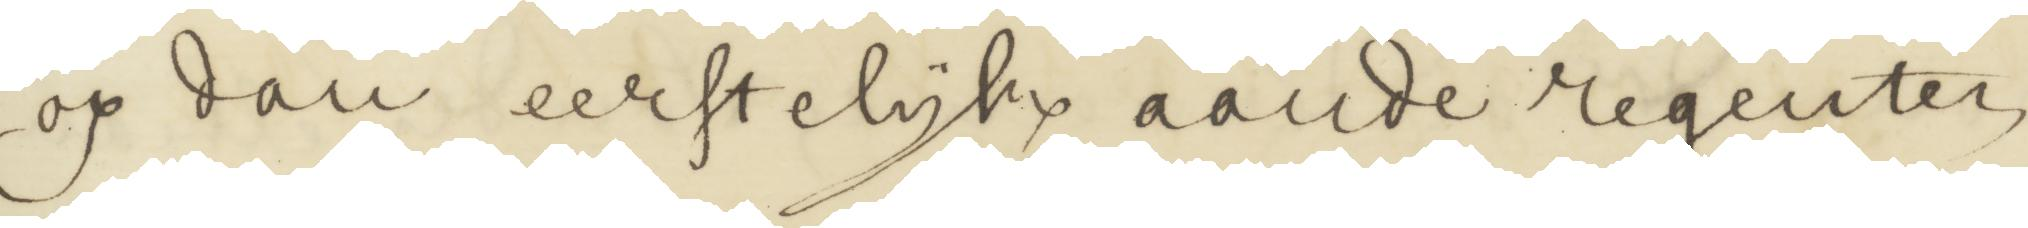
op dan eerstelijkx, aande regenten
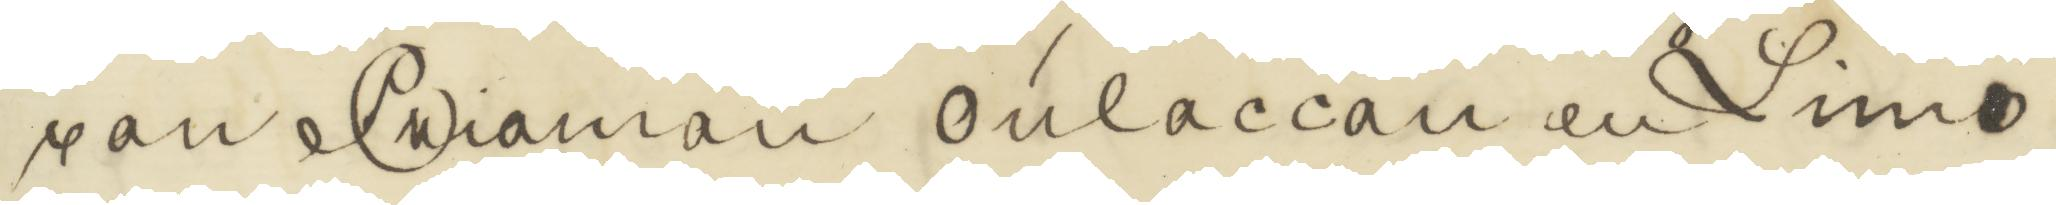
van Priaman Oulaccan en Limo
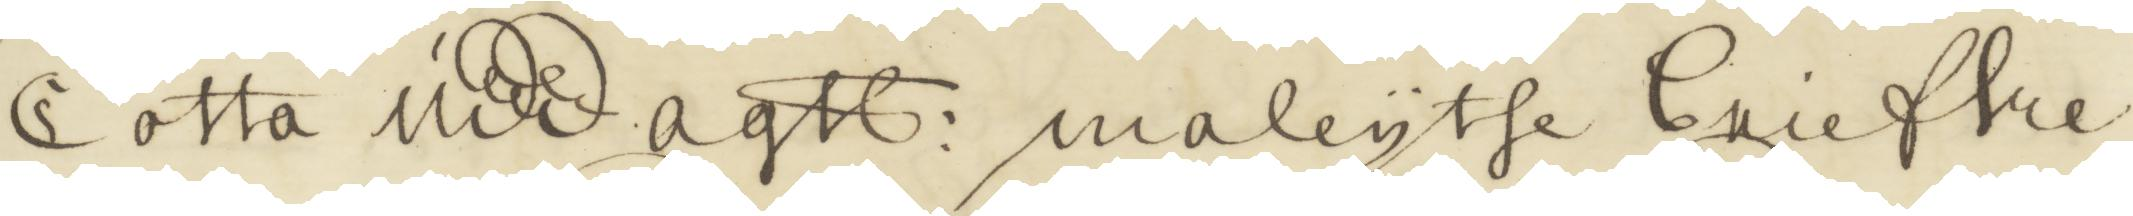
Cotta uEE agtb: maleijtse briefke
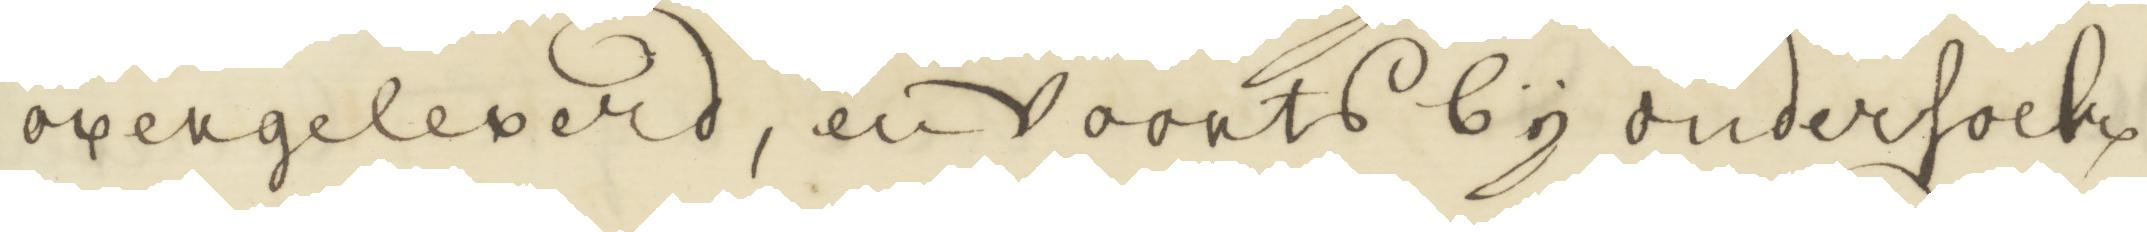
overgeleverd, en voorts bij ondersoek
